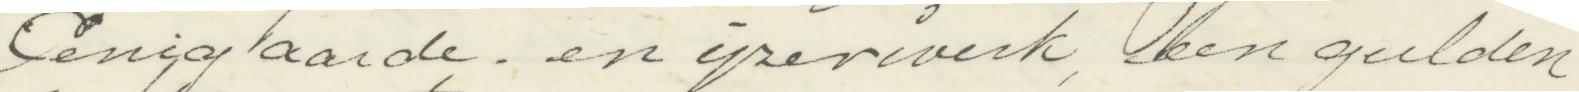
Eenig aarde - en ijzerwerk, een gulden
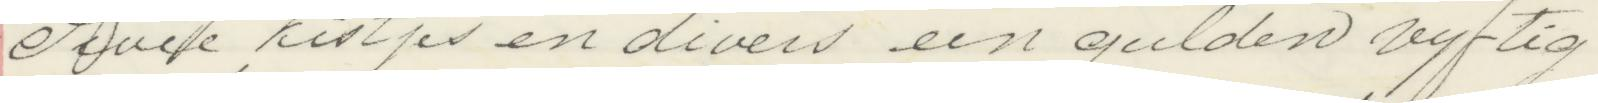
Twee kistjes en divers, een gulden vyftig
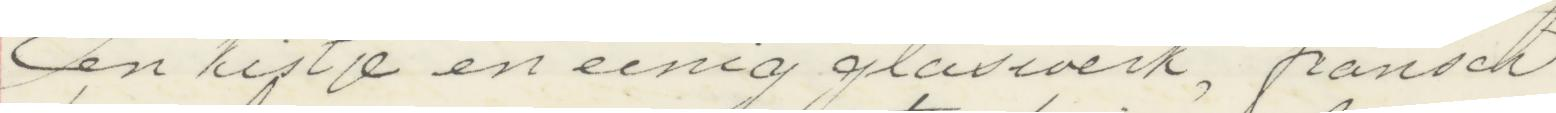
Een kistje en eenig glaswerk, fransch
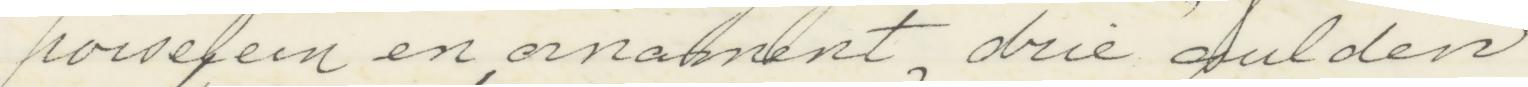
porselein en ornament, drie gulden
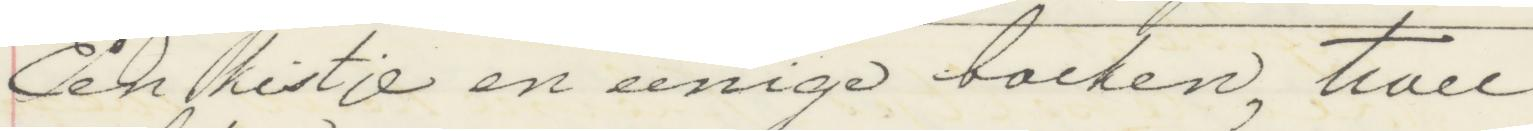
Een kistje en eenige boeken, twee
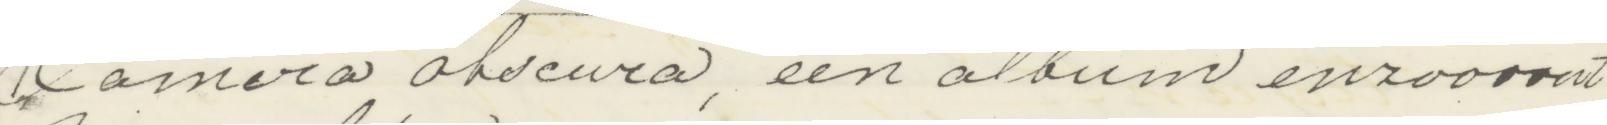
¶„Camera obscura", een album enzoovoort
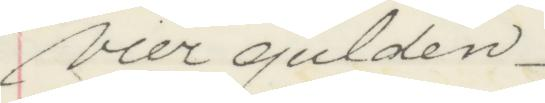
vier gulden
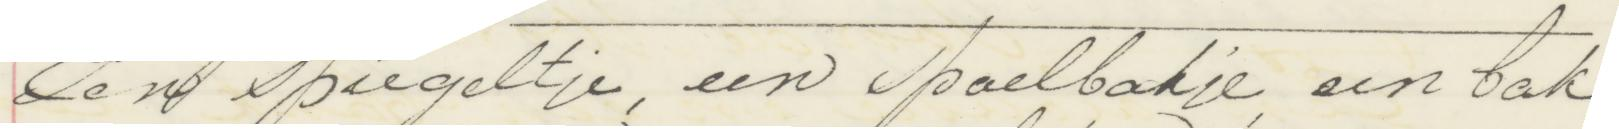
Een spiegeltje, een spoelbakje, een bak
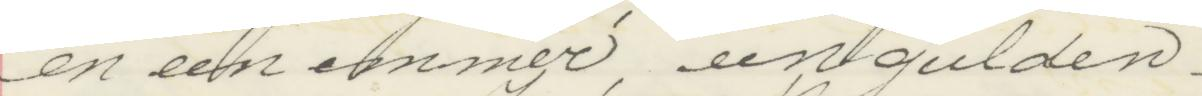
en een emmer, een gulden
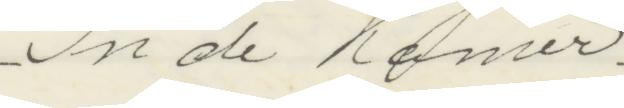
In de kamer.
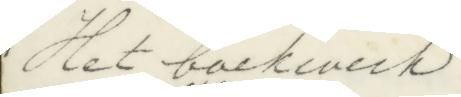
Het boekwerk
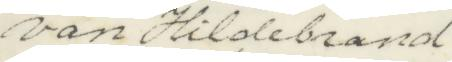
van Hildebrand
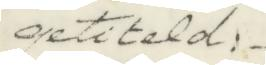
getiteld:
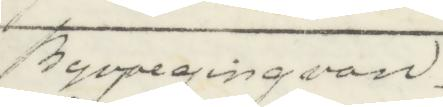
Byvoeging van
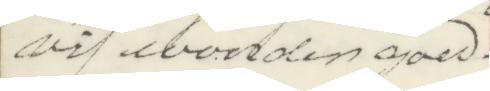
vif woorden goed
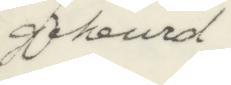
gekeurd
